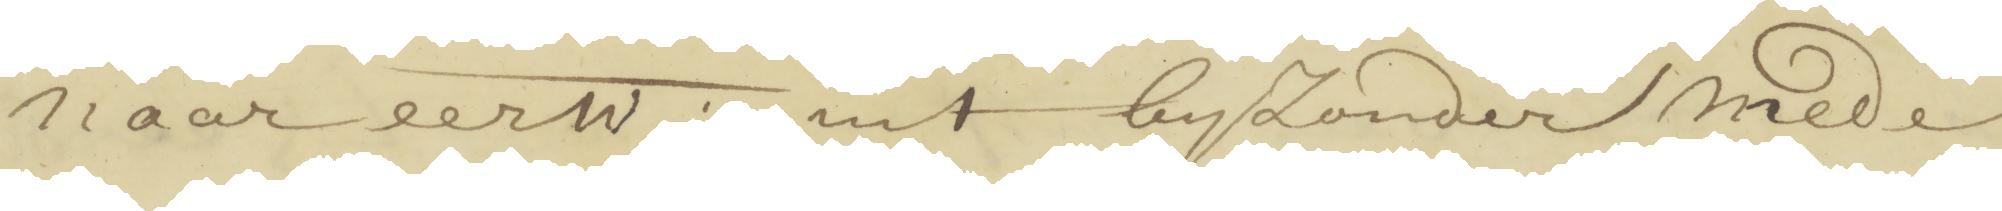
naar eerw: int byzonder mede
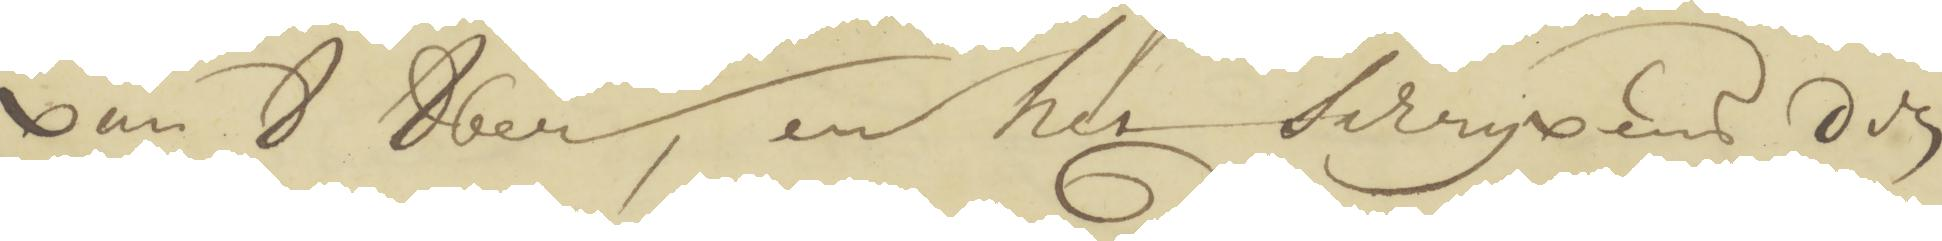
van 8 8ber, en het schryvens den
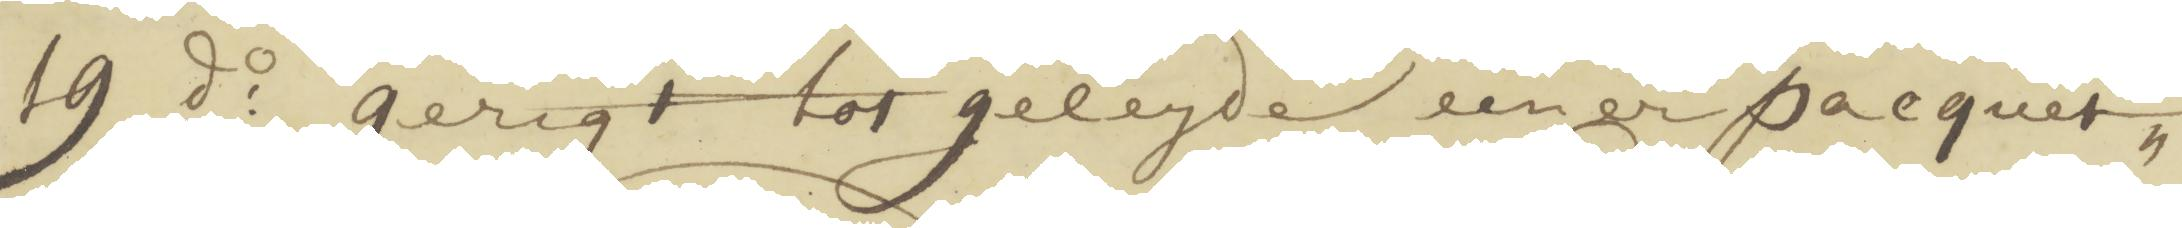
19 d:o gerigt tot geleyde eener pacquet„
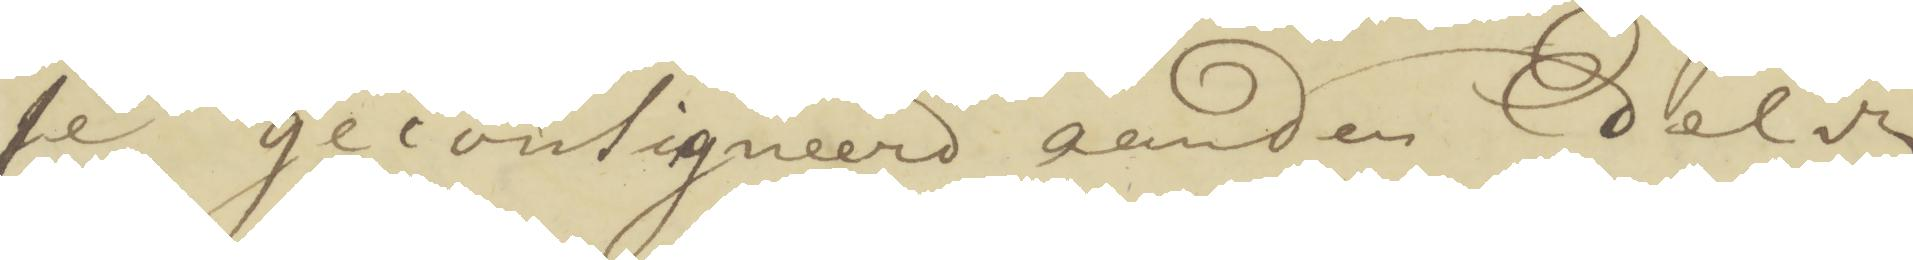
je geconsigneerd aan den Edelen
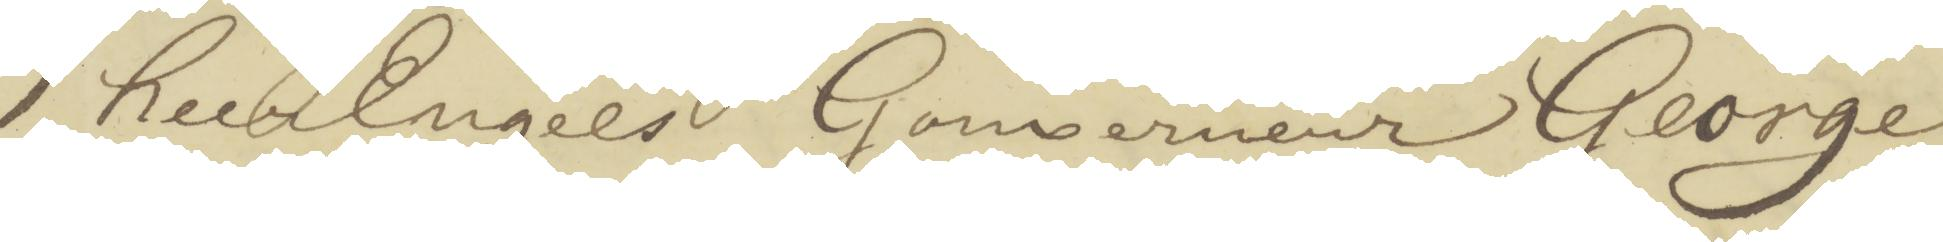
heer Engels Gouverneur George
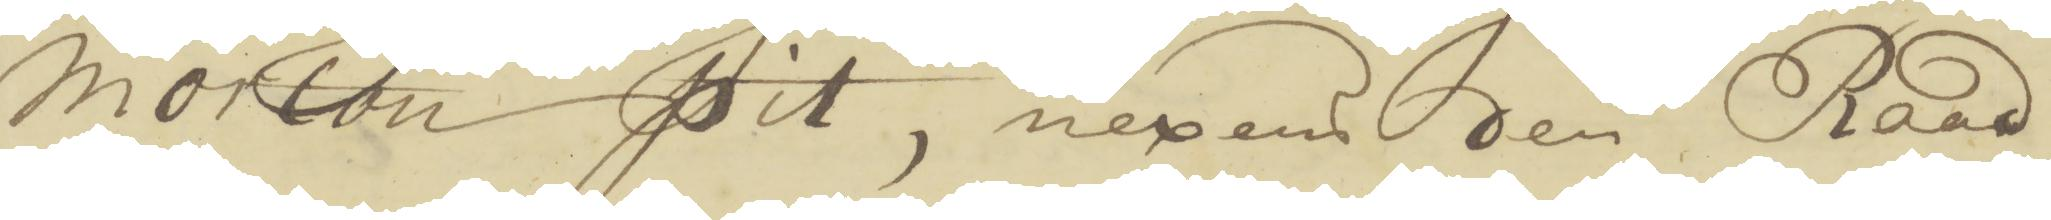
morton pit, neven den Raad
